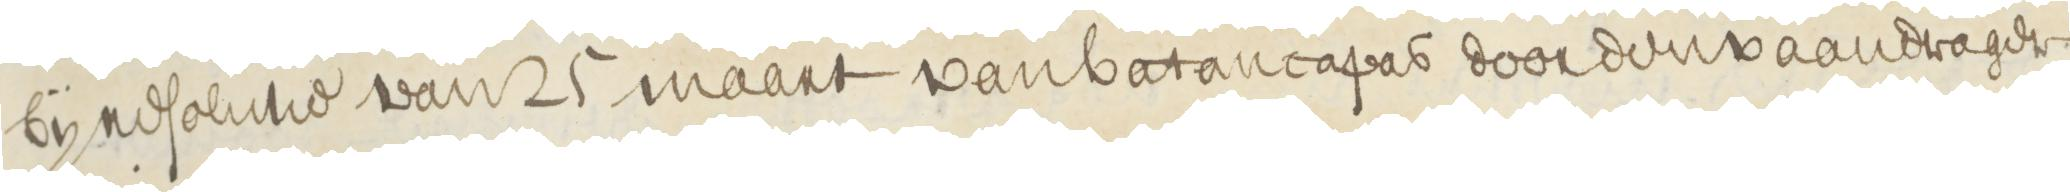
bij resolutie van 25 maart van batan capas door den vaandrager
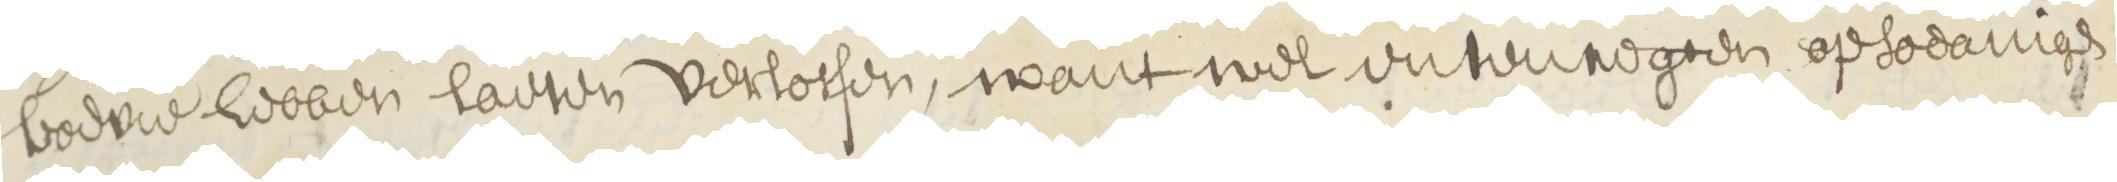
boevie hebben laeten verlossen, want wel en ten regten op sodanigen
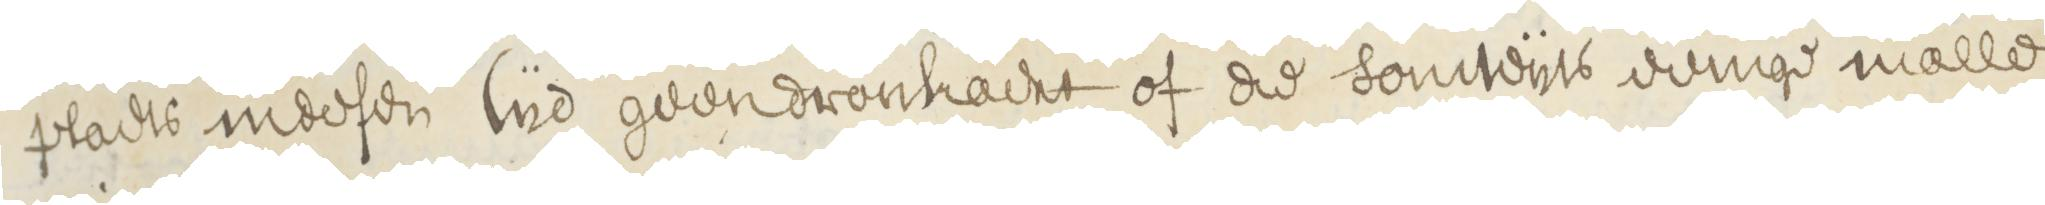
plaets in desen tijd geen dronkaert of die somteijts eenige malle
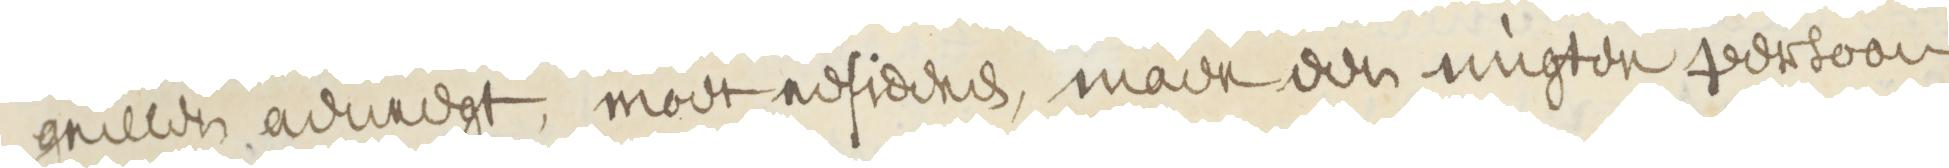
grillen aenregt, moet resideren, maer een nugter persoon,
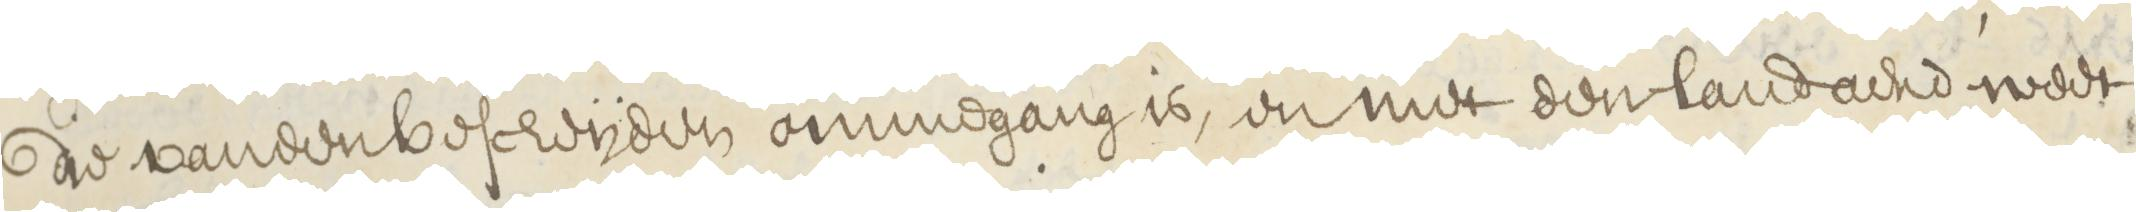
die van den bescheijden ommegang is, en met den landaerd weet
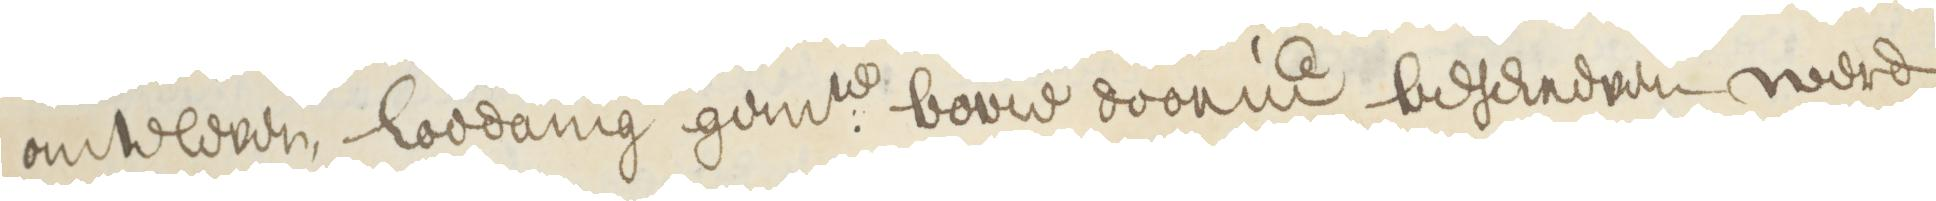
om te leven, hoedanig gem:te bovie door uE beschreven werd
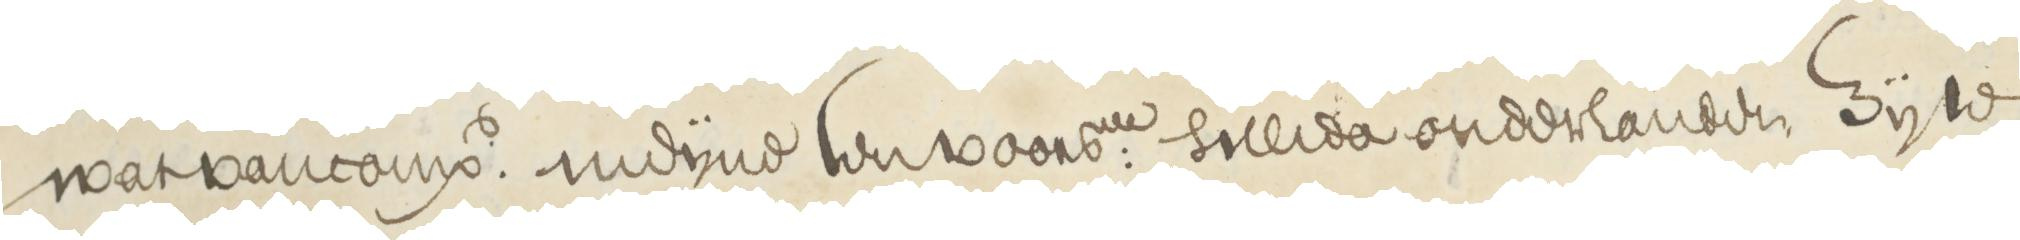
wat van comp:s meijne ten voors:de sillida onderhanden Zij te
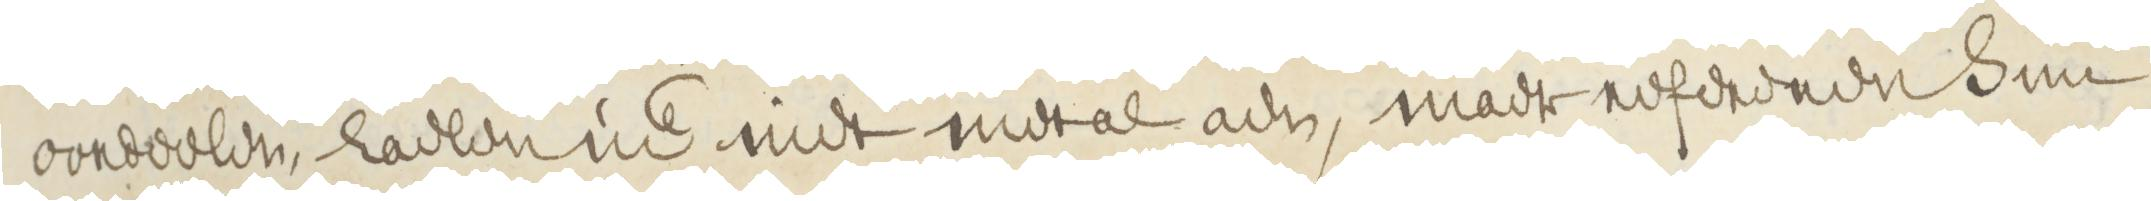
oordeelen, haelen uE niet met al aen, maer refereren hun
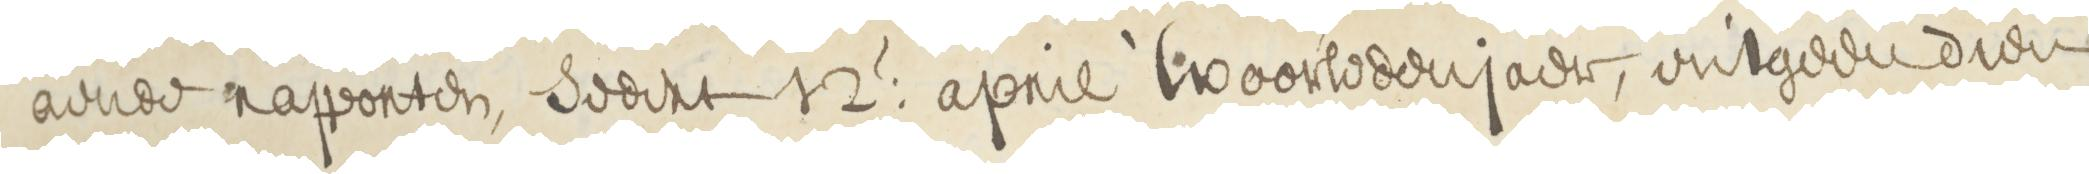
aende rapporten, sedert 12': april 't voorleden jaer, en ’t geen dien
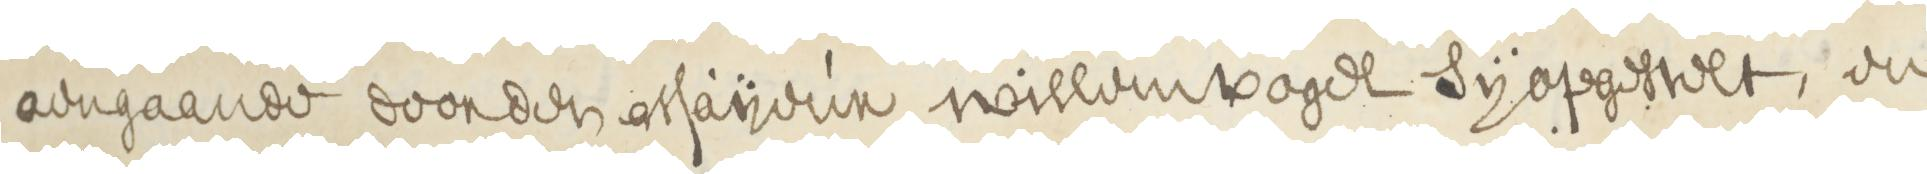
aengaande door den assaijeur willem vogel sij opgestelt, en
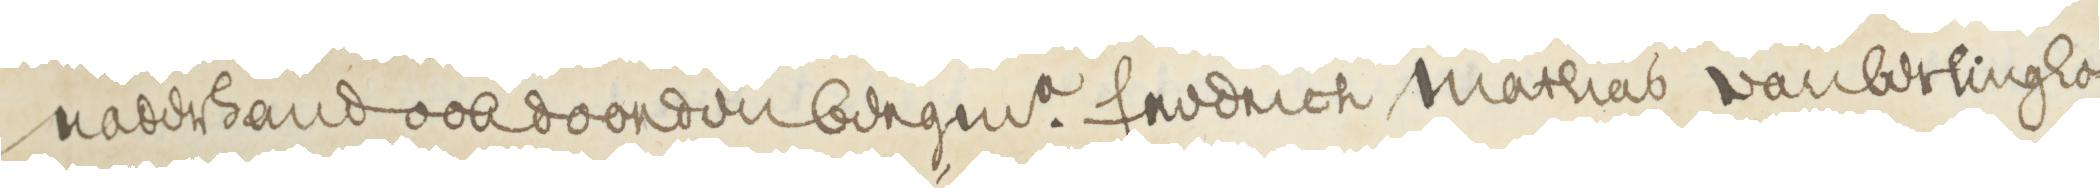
naderhand ook door den bergm:r Fredrick Mathias van berlingho
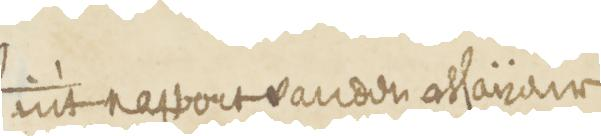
uijt rapport van den assaijeur
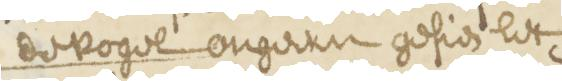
de vogel ongeern gesien het
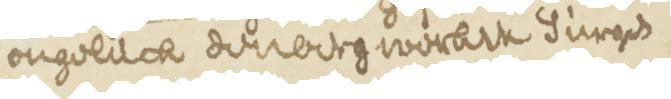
ongeluck den bergwerker Iurgen
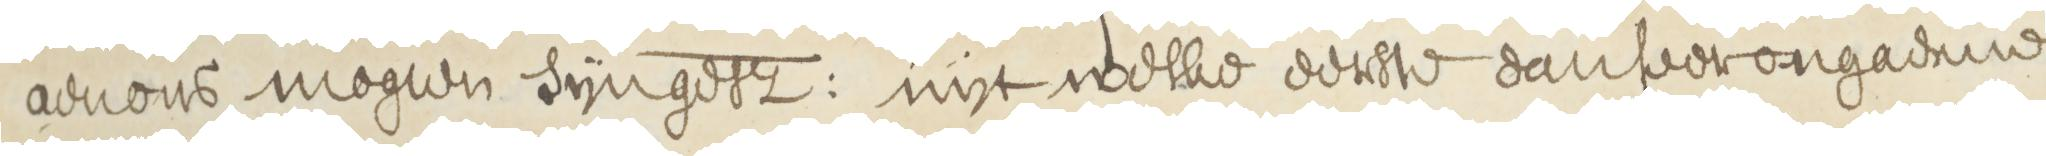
aen ons mogten sijn gesz: uijt welke eerste dan seer ongaerne
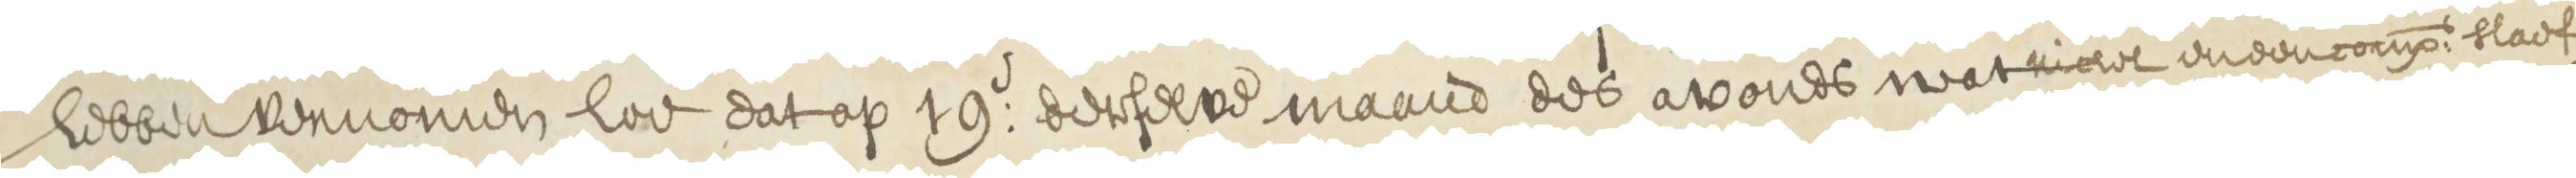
hebben vernomen hoe dat op 19:e derselve maand des avonds wat richel en een comp:s slaef
